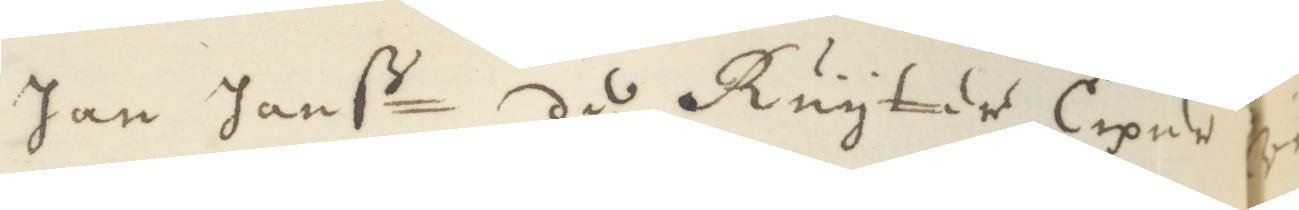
Jan Jans=t de Ruijter Cipier
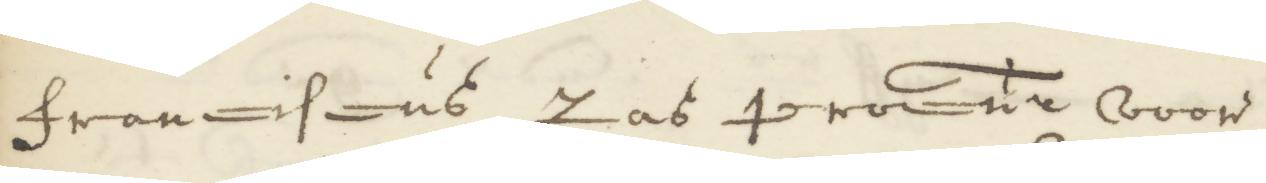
Franciscus Zas procur voor
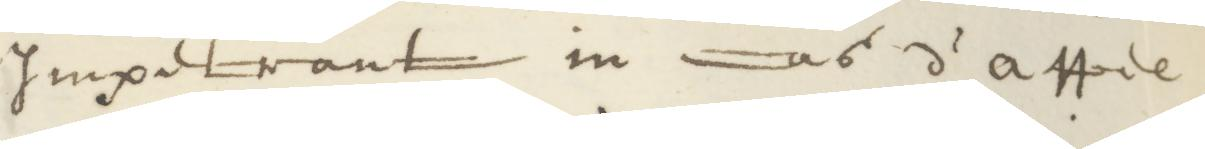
Jmpetrant in cas d’ appel
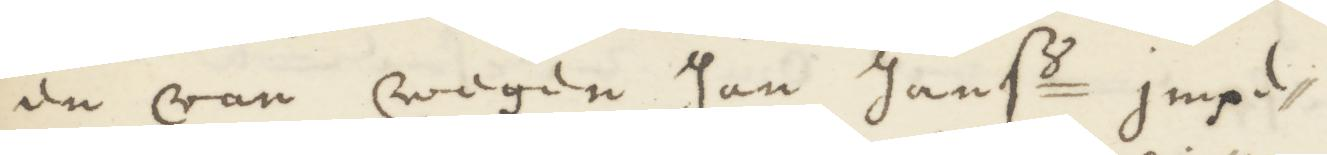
en van wegen Jan Jans=z jmpe„
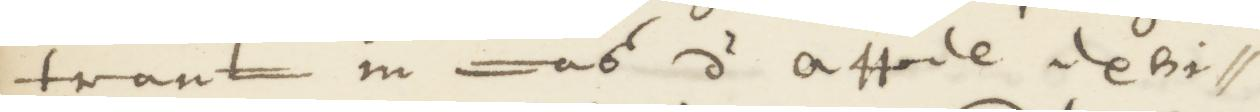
trant in cas d’ appel exhi„
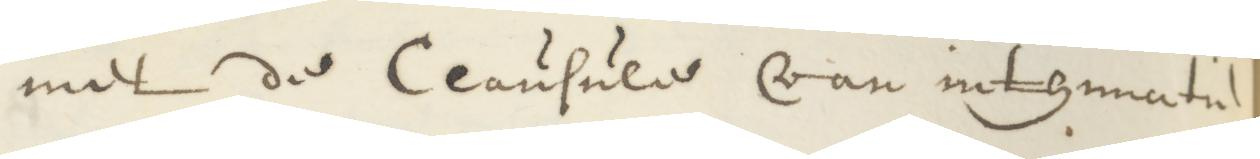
met de Clausule van inthimatie
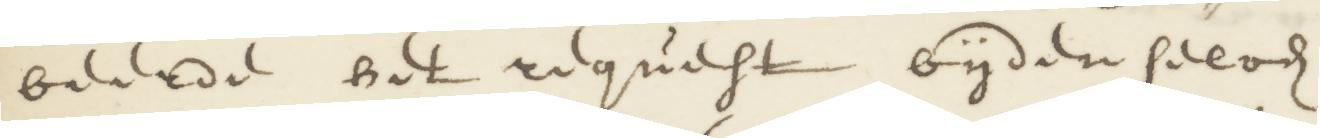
beerde het request bij den selven
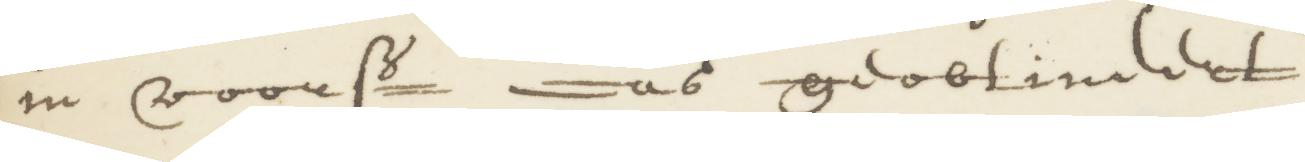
in voors=z cas geobtineert
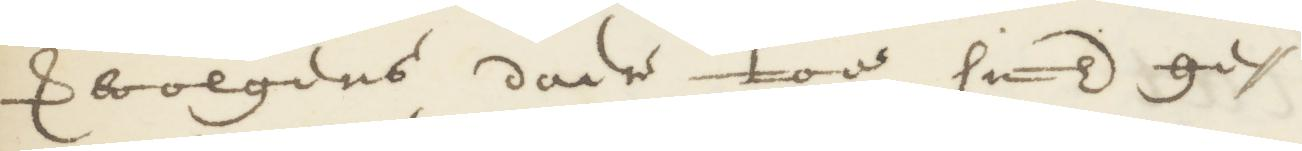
vervolgens daer toe sich ge„
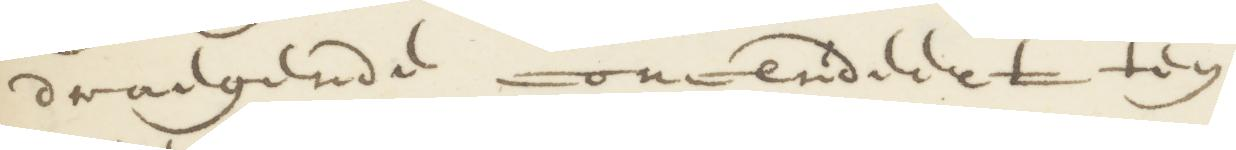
draegende concendeert ten
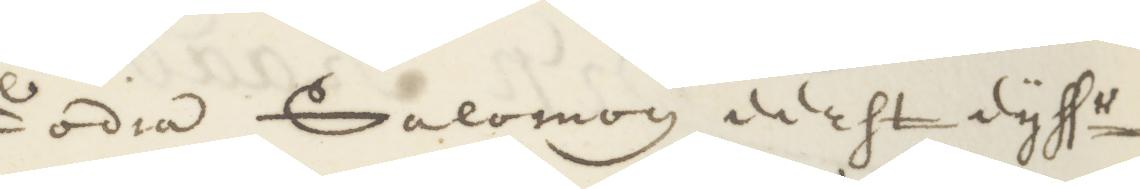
Godia Salomon eerst eijss=r
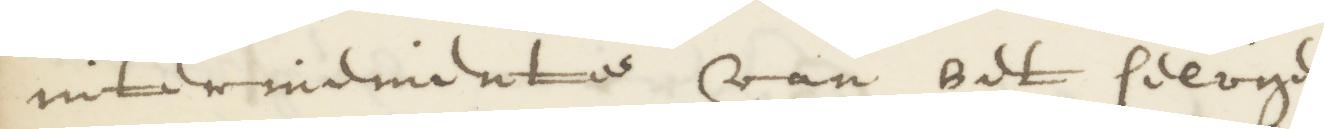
intervieniente van het selvige
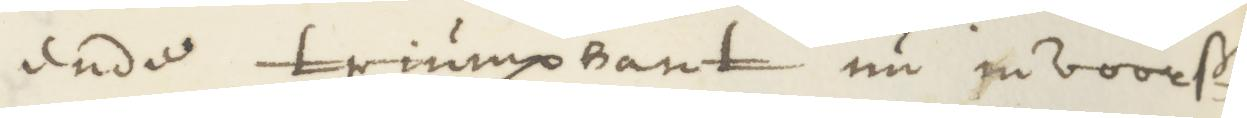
ende triumphant nu in voorsz
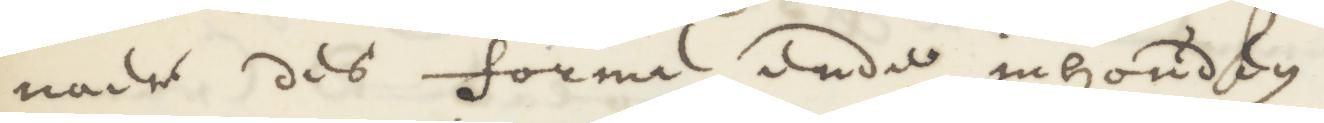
naer des forme ende inhouden
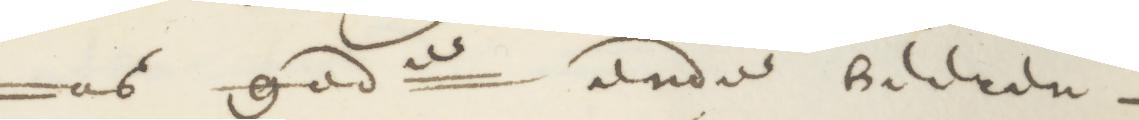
cas ged=e ende heeren
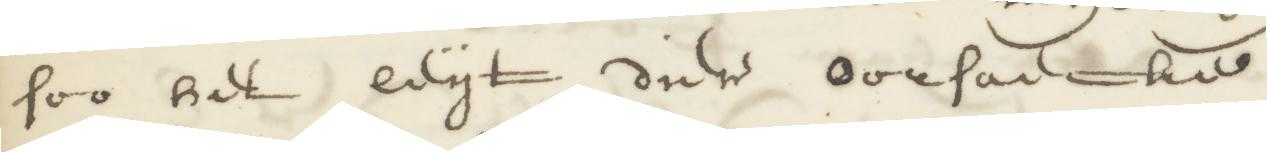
soo het leijt dien oorsaecke
